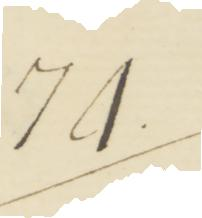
74.
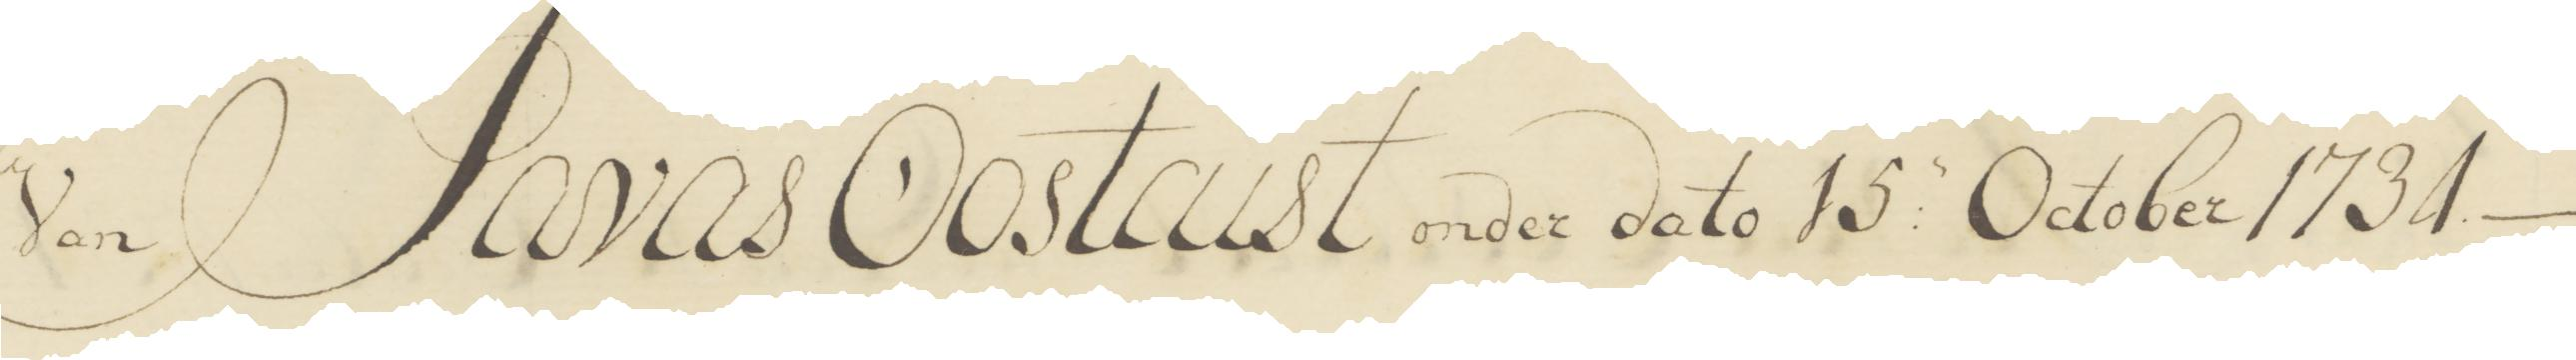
Van Javas Oostcust onder dato 15:' October 1734. —
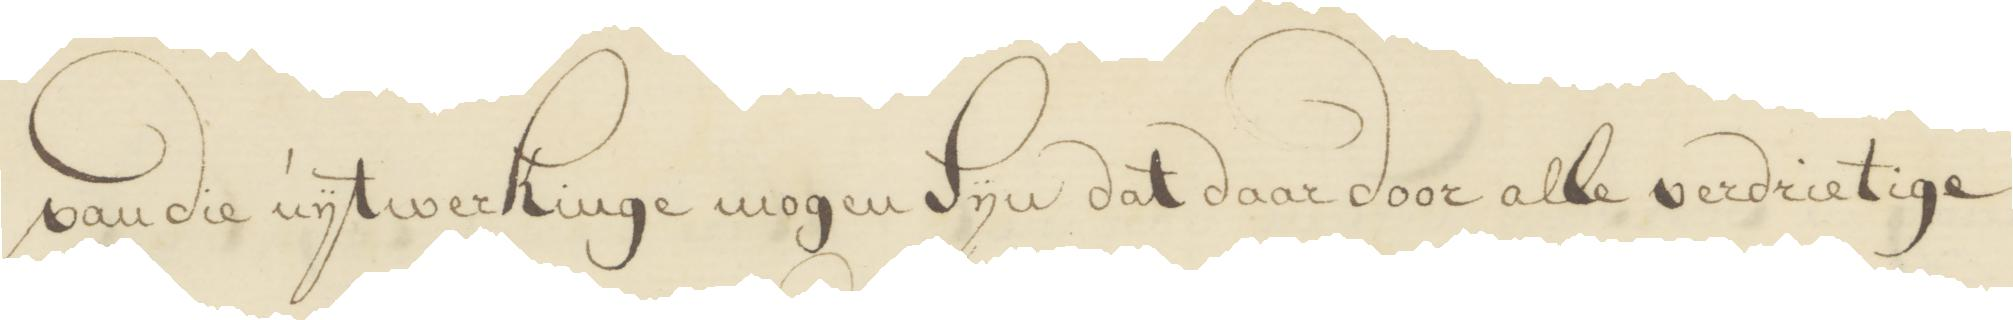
van die uijtwerkinge mogen sijn dat daar door alle verdrietige
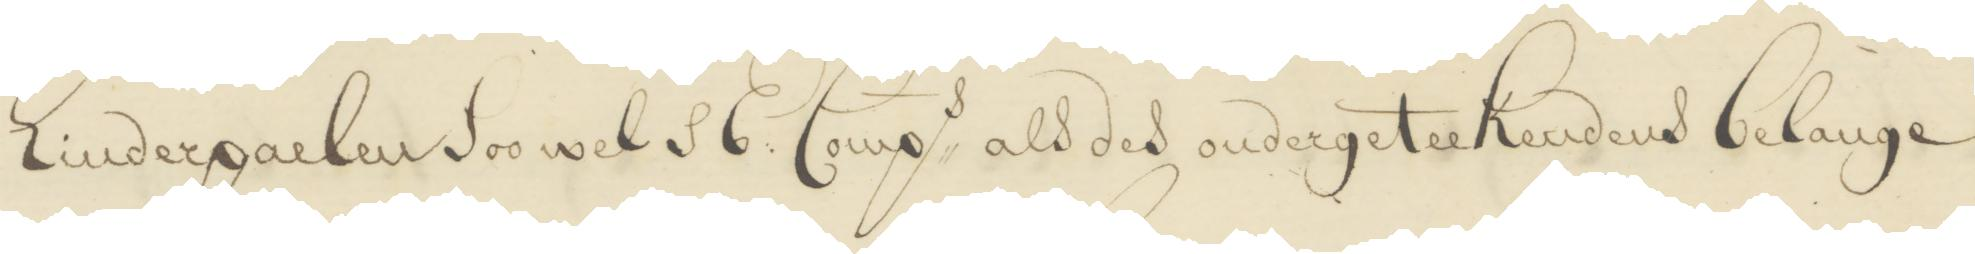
hinderpaelen soo wel 's E: Comp„s als des ondergeteekendens belange
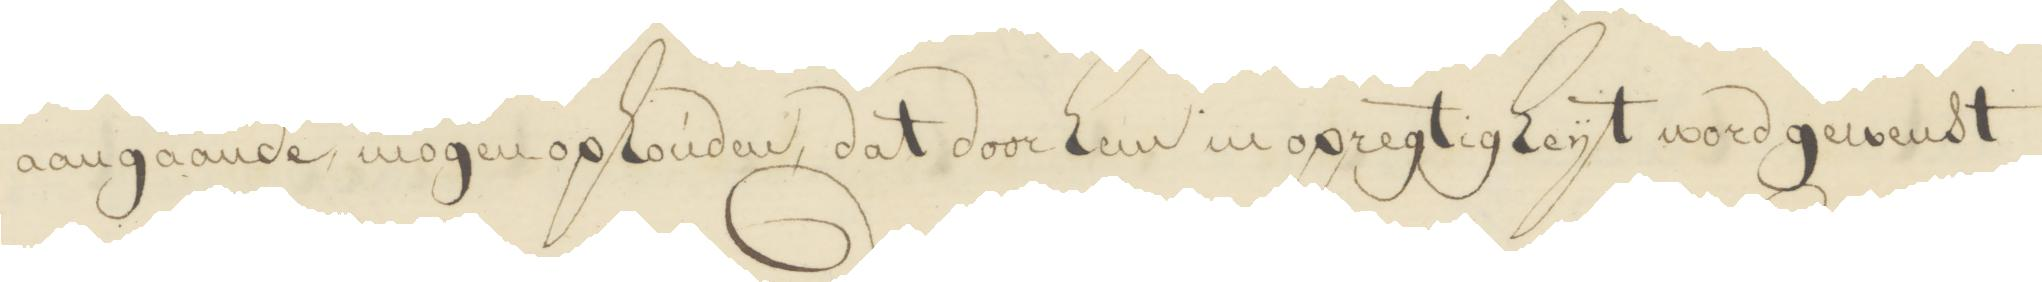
aangaande, mogen ophouden, dat door hem in opregtigheijt word gewenst
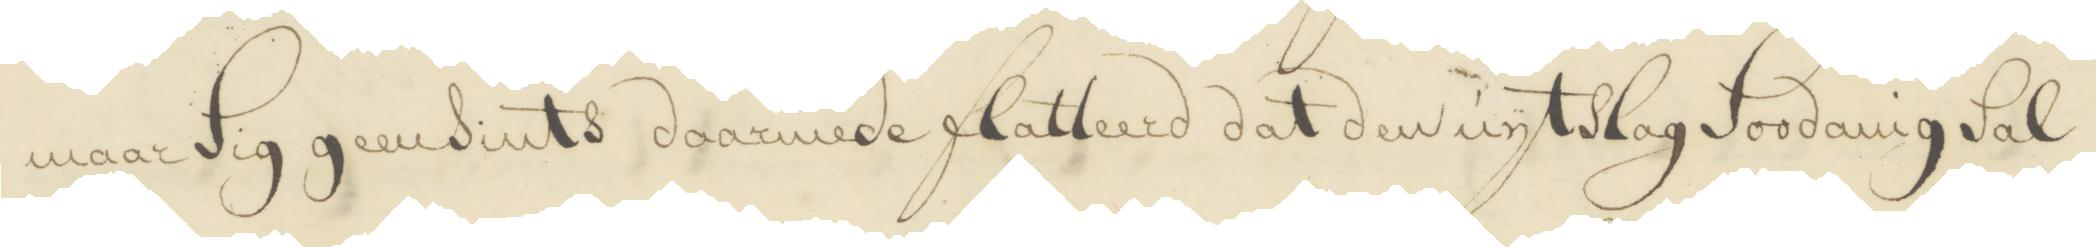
maar sig geensints daarmede flatteerd dat den uijtslag soodanig sal
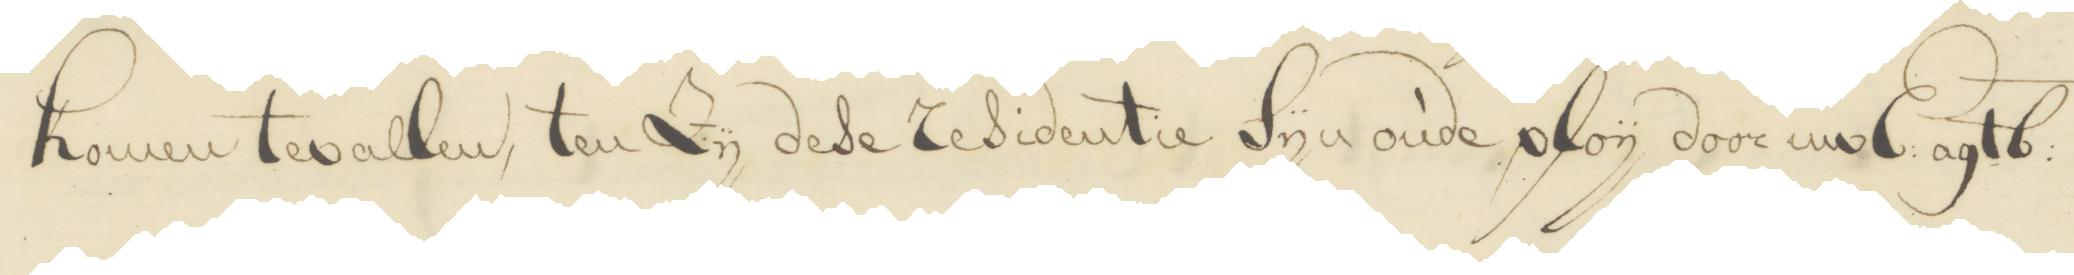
komen tevallen, ten zij dese residentie sijn oude ploij door uw E: agtb:
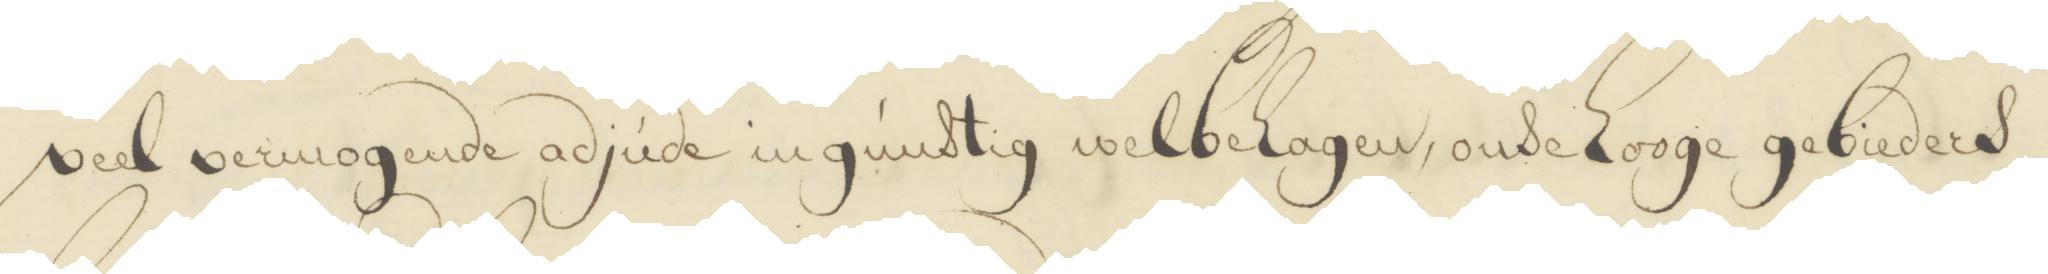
veel vermogende adjude in gunstig wel behagen, onse hooge gebieders
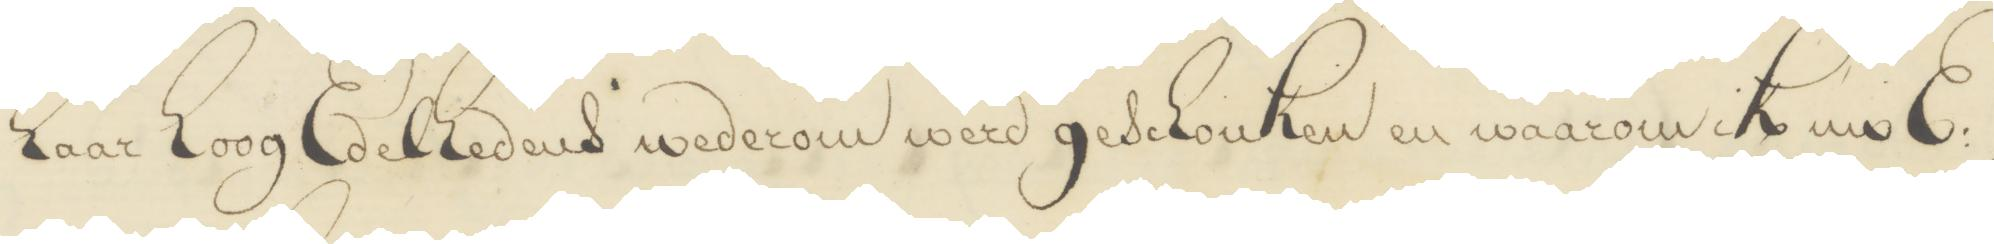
haar hoog Edelhedens wederom werd geschonken en waarom ik uw E:
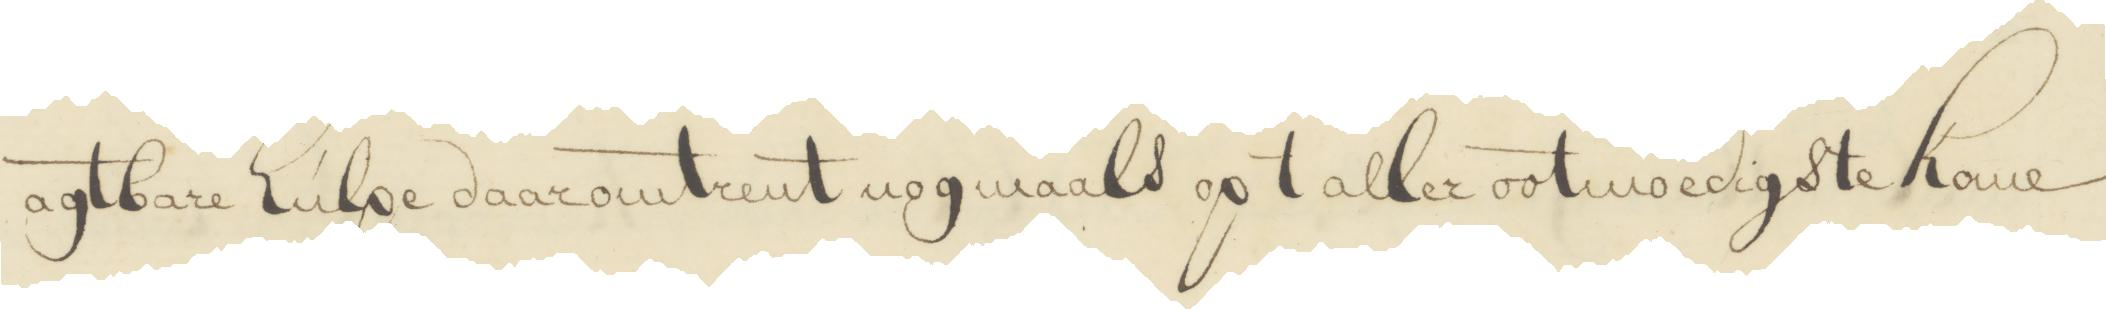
agtbare hulpe daar omtrent nog maals op ’t aller ootmoedigs te kome
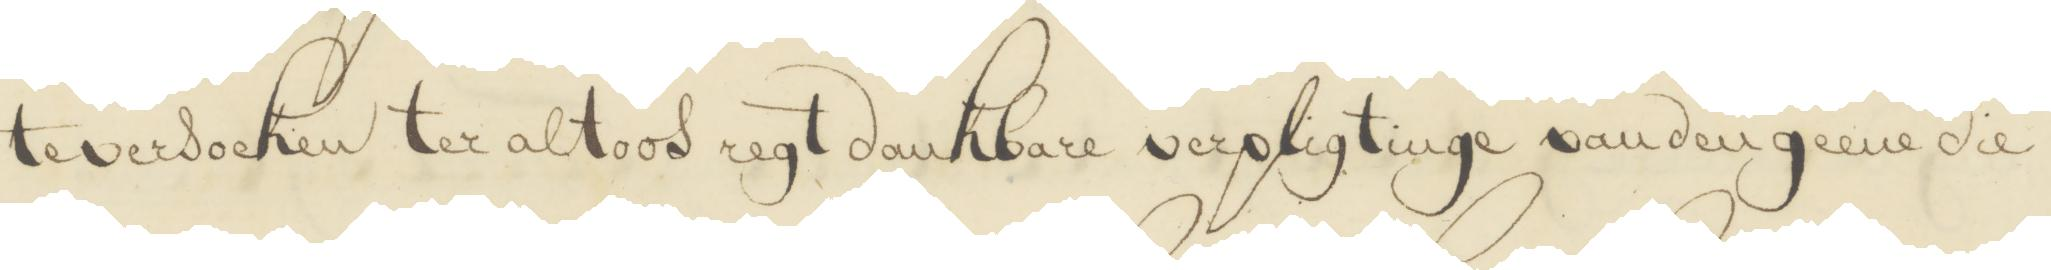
te versoeken ter altoos regt dankbare verpligtinge van den geene die
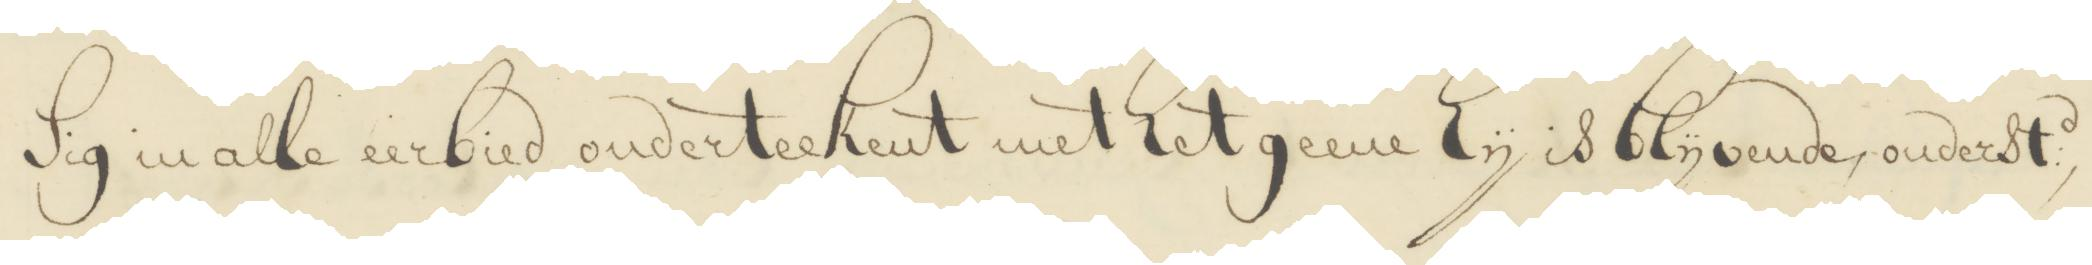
sig in alle eerbied onderteekent met het geene hij is blijvende, onderst:d,
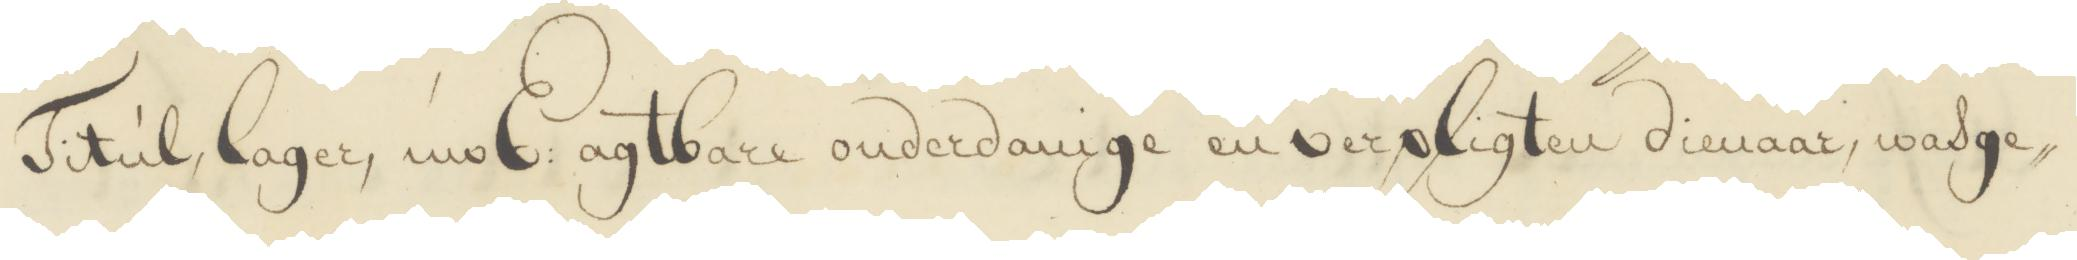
Titul, lager, uw E: agtbare onderdanige en verpligten dienaar, was ge„
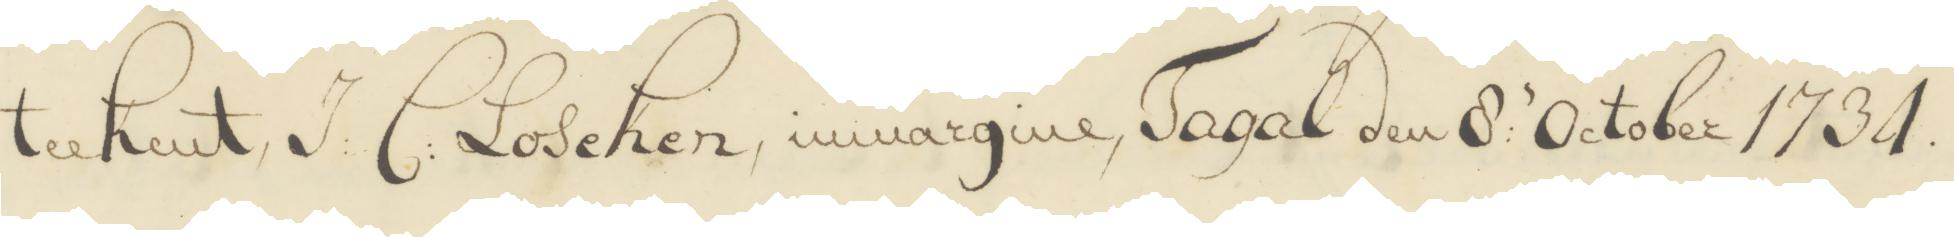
teekent, I: C: Loseken, inmargine, Tagal den 8:en October 1734.
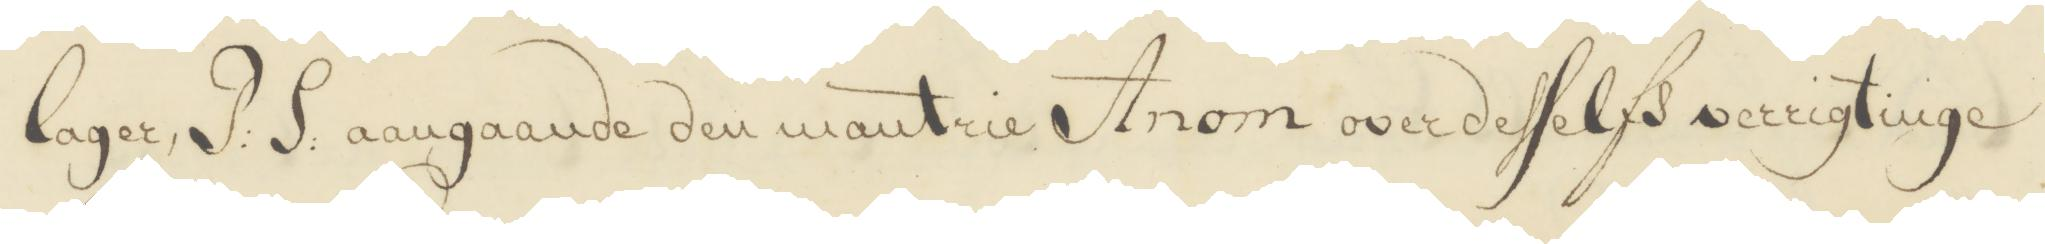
lager, P: S: aangaande den mantrie Anom over desselfs verrigtinge
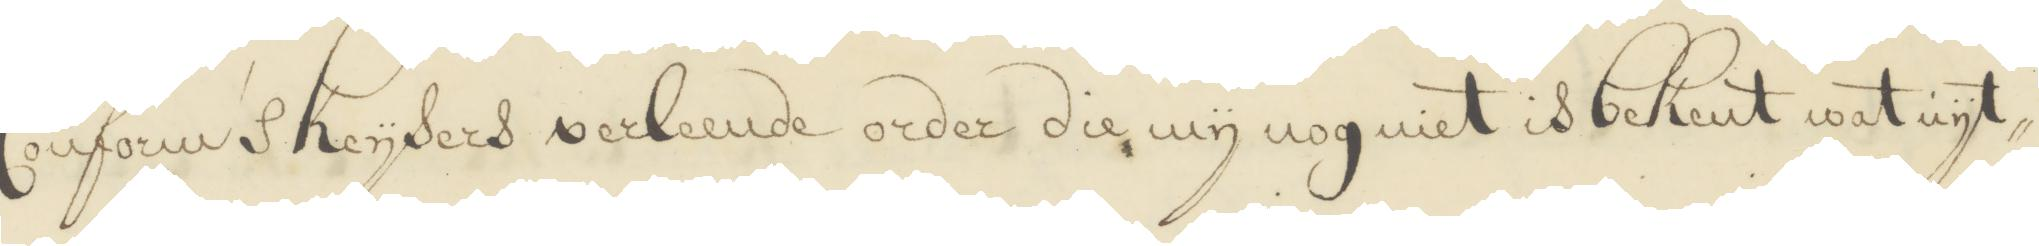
Conform 's keijsers verleende order die mij nog niet is bekent wat uijt„
